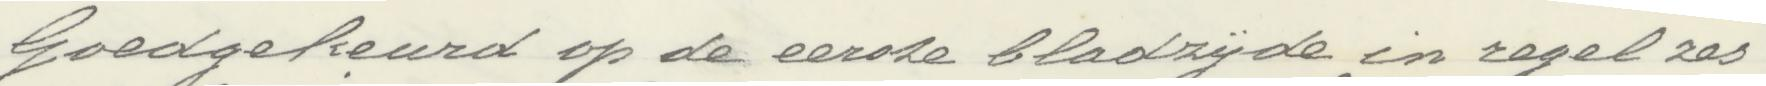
Goedgekeurd op de eerste bladzijde in regel zes
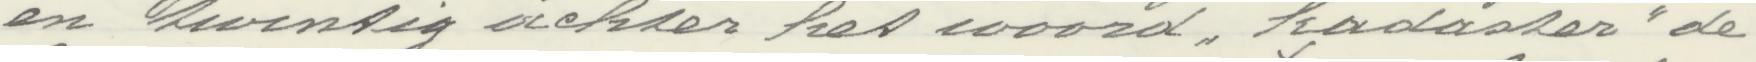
en twintig achter het woord „ kadaster " de
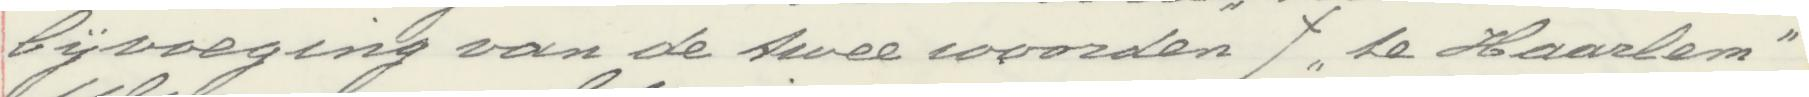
bijvoeging van de twee woorden / „ te Haarlem "
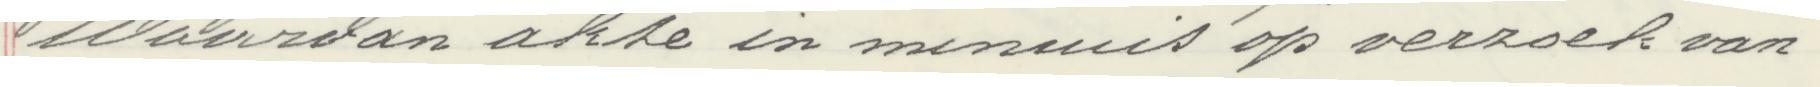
Waarvan akte in minuut op verzoek van
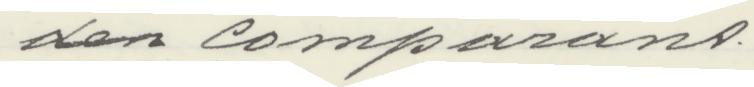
den Comparant.
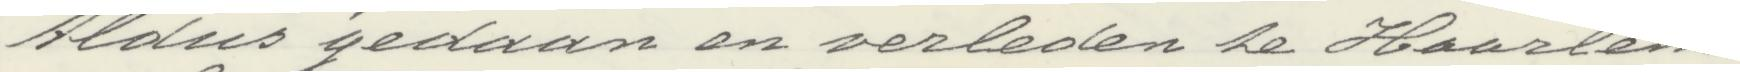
Aldus gedaan en verleden te Haarlem
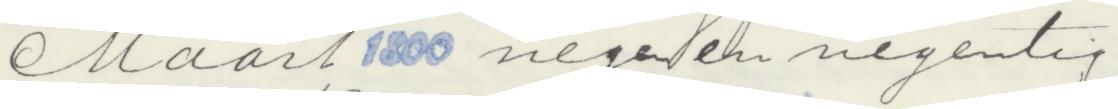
Maart 1800 negen en negentig
